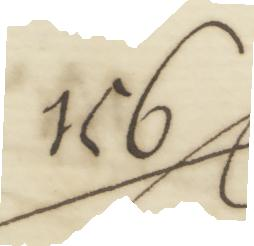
156
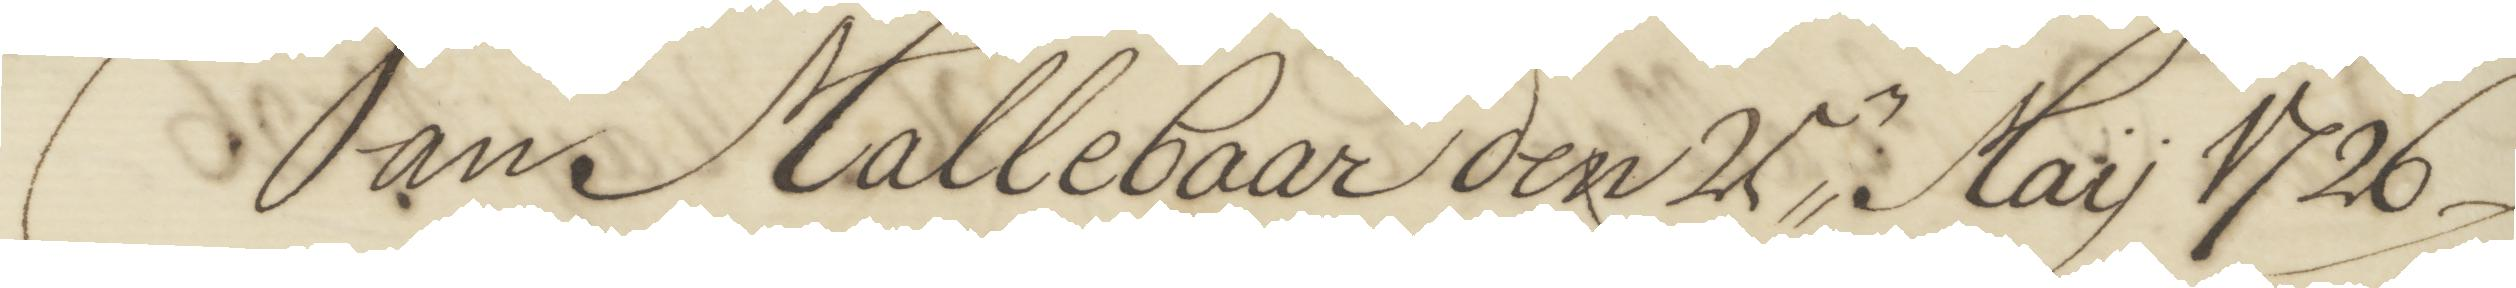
Van Mallebaar den 25„en Maij 1726 —
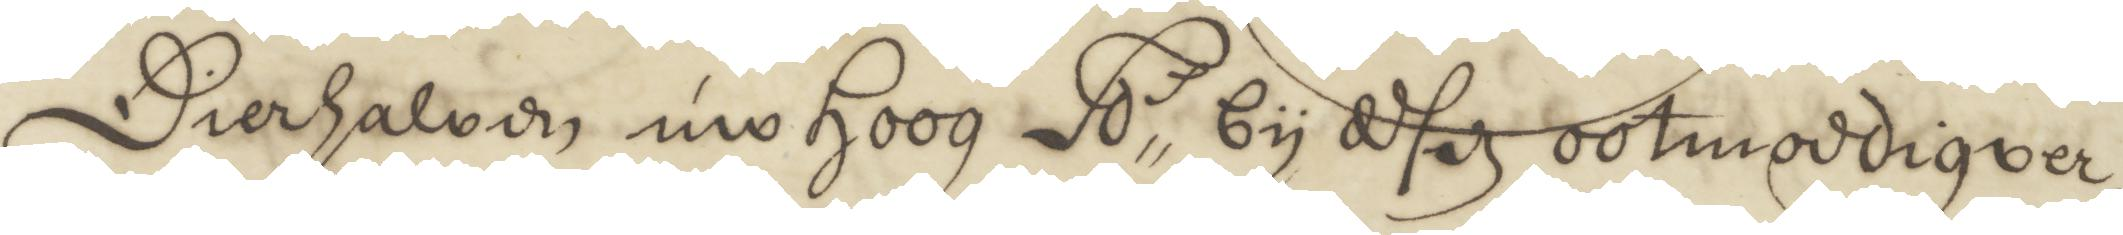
Dierhalven uw hoog Ed„s bij desen ootmoedig ver
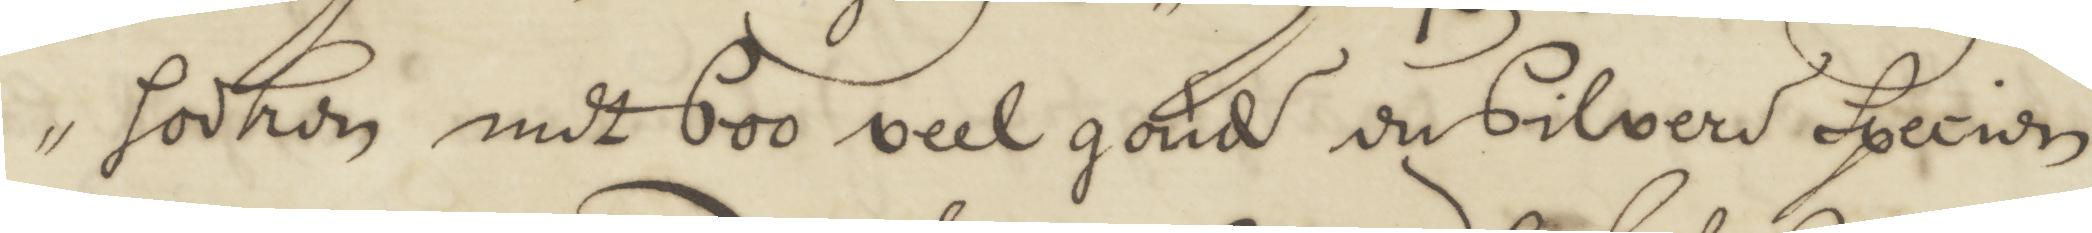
„soeken met soo veel goude en silvere specien
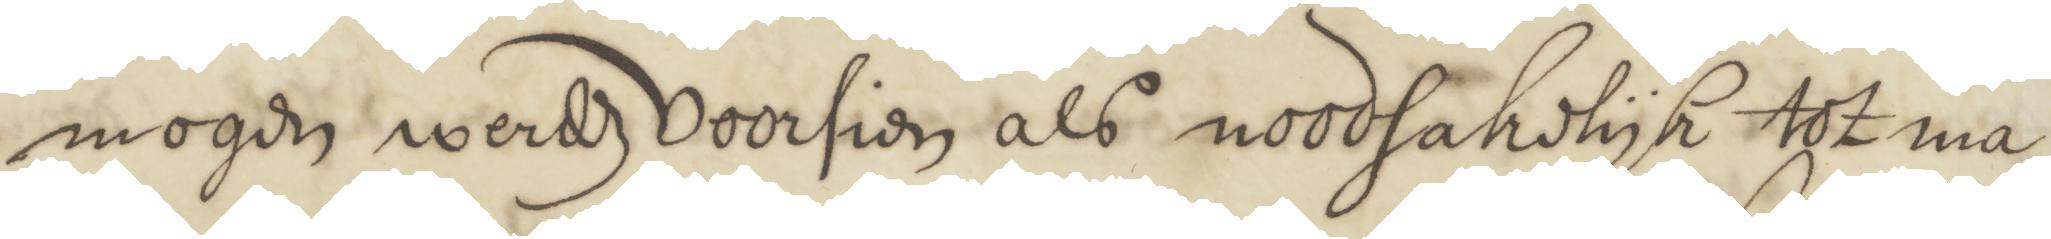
mogen werden voorsien als noodsakelijk tot ma
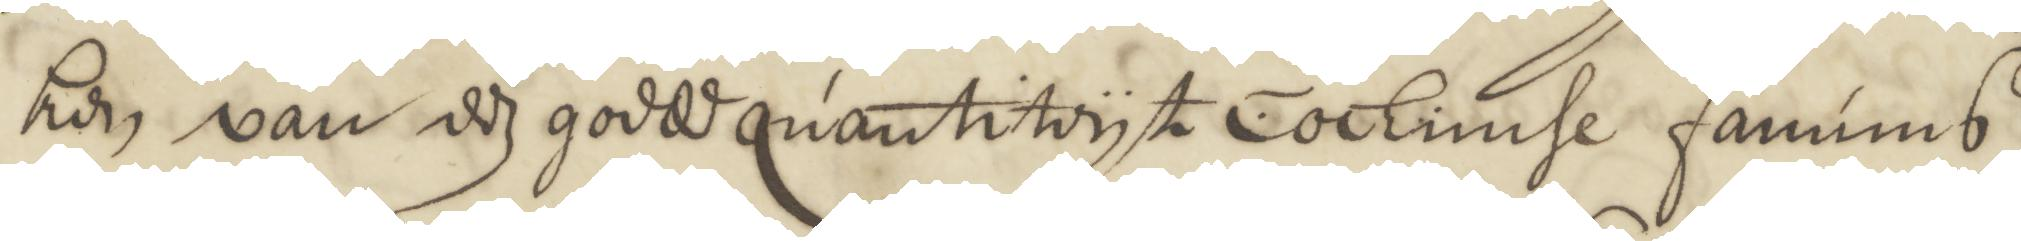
ken van een goede quantiteijt cochimse fanums
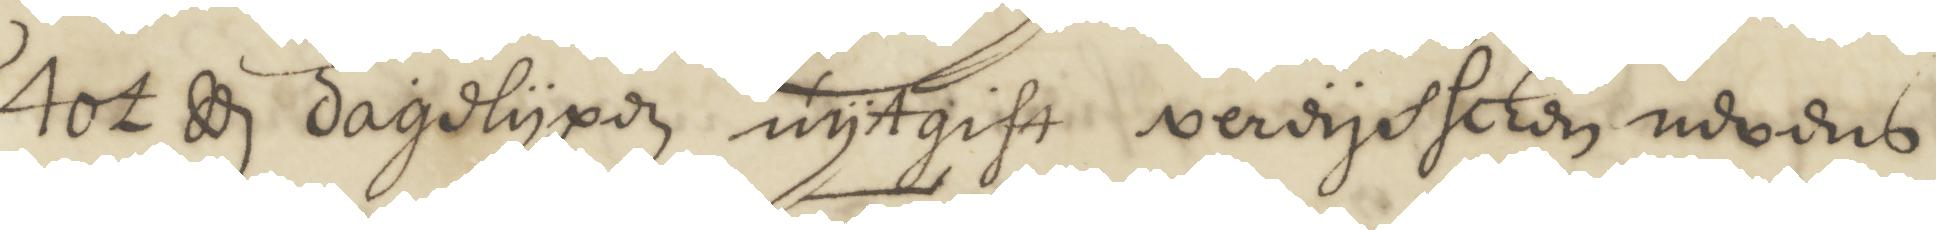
tot den dagelijxen uijtgift vereijsschen nevens
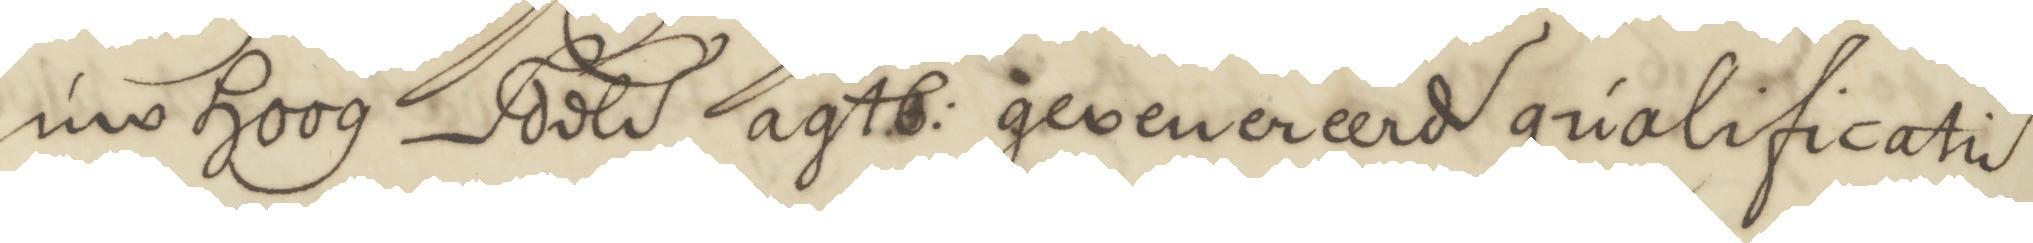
uw Hoog Edele agtb: gevenereerde qualificatie
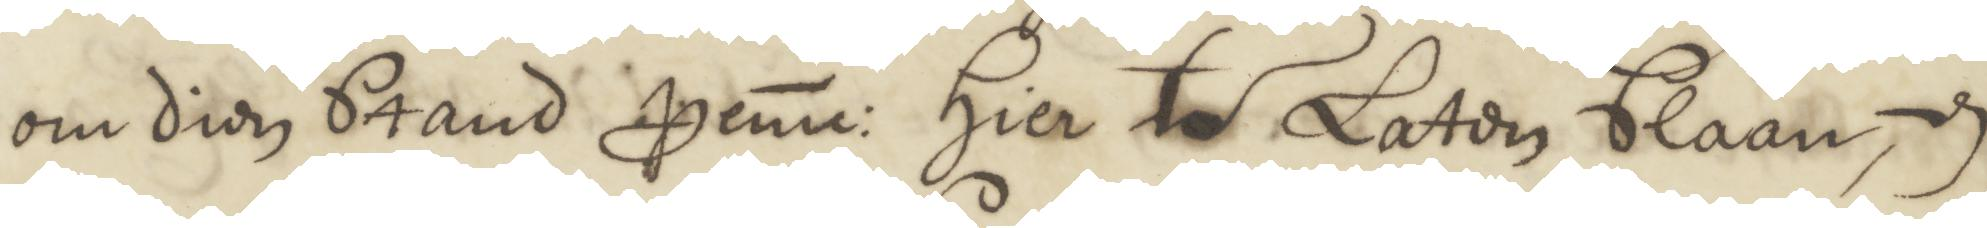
om dien stand penn: hier te Laten slaan, en
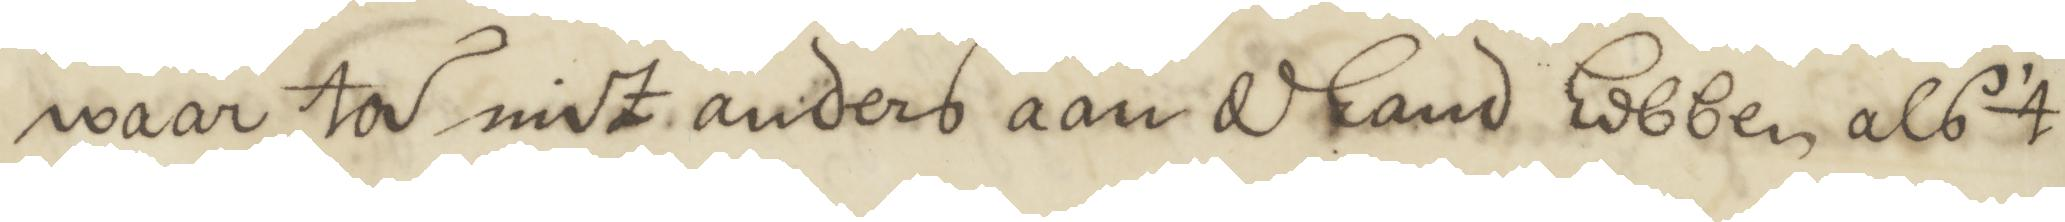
waar toe niet anders aan de hand hebben als ’t
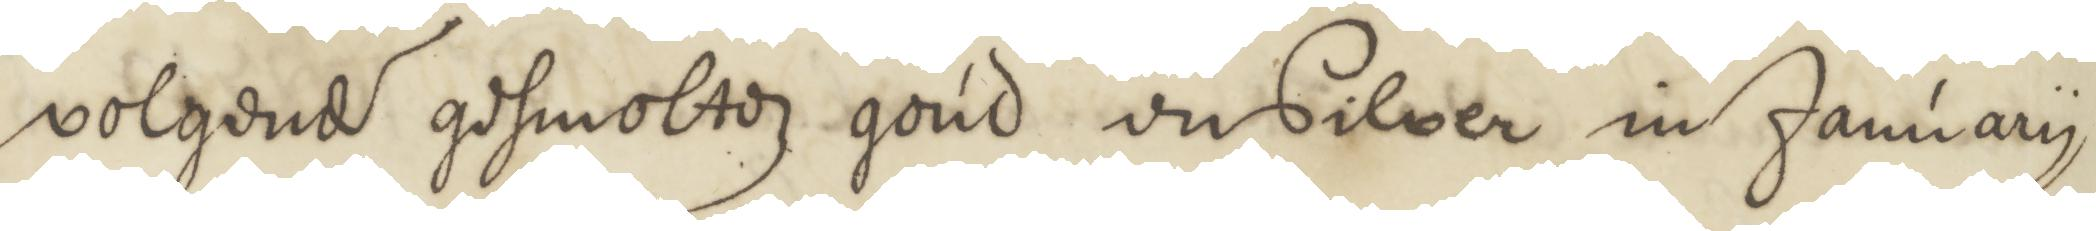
volgende gesmolten goud en silver in Januarij
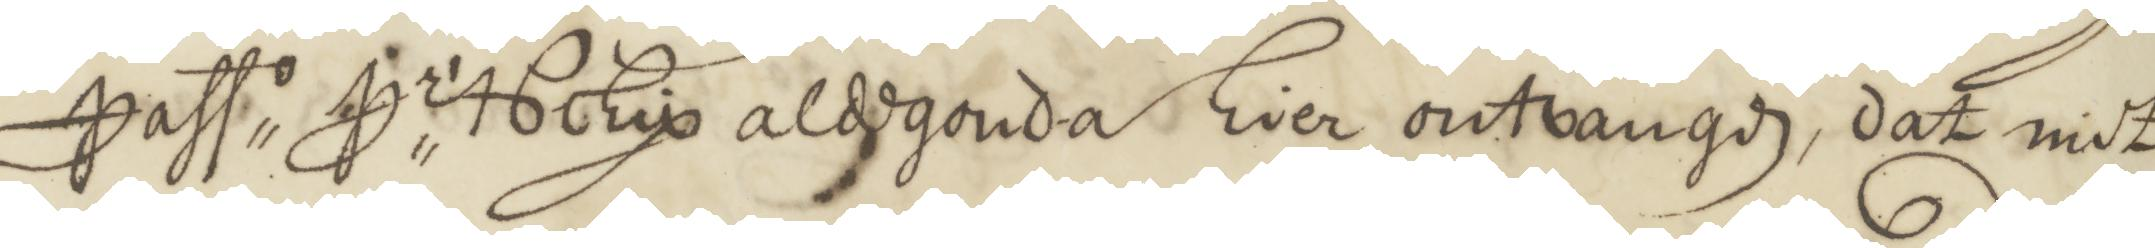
pass„o p„r 'tschip aldegonda hier ontvangen, dat niet
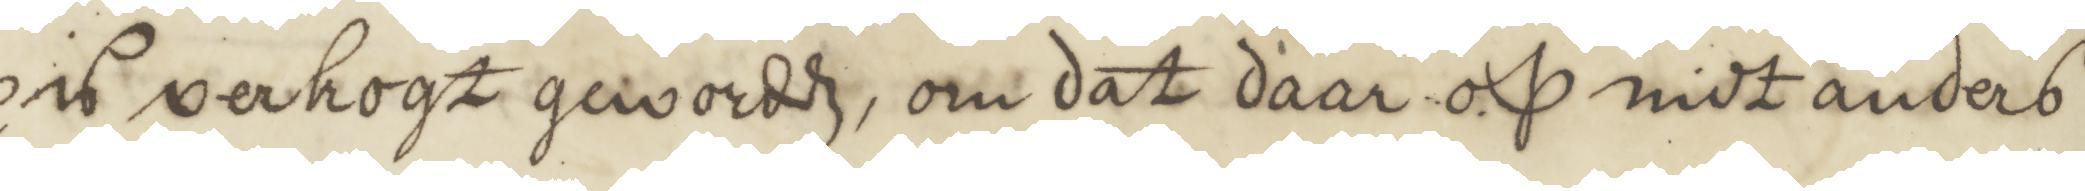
is verkogt geworden, om dat daar op niet anders
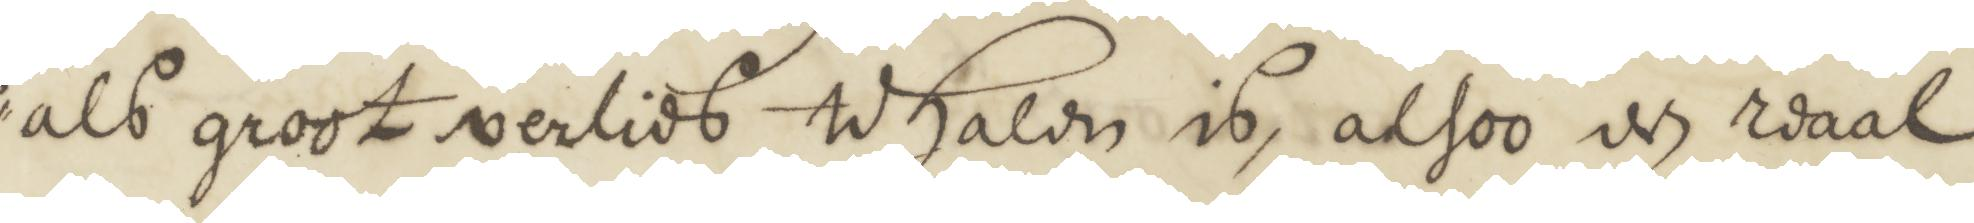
als groot verlies tehalen is, alsoo een reaal
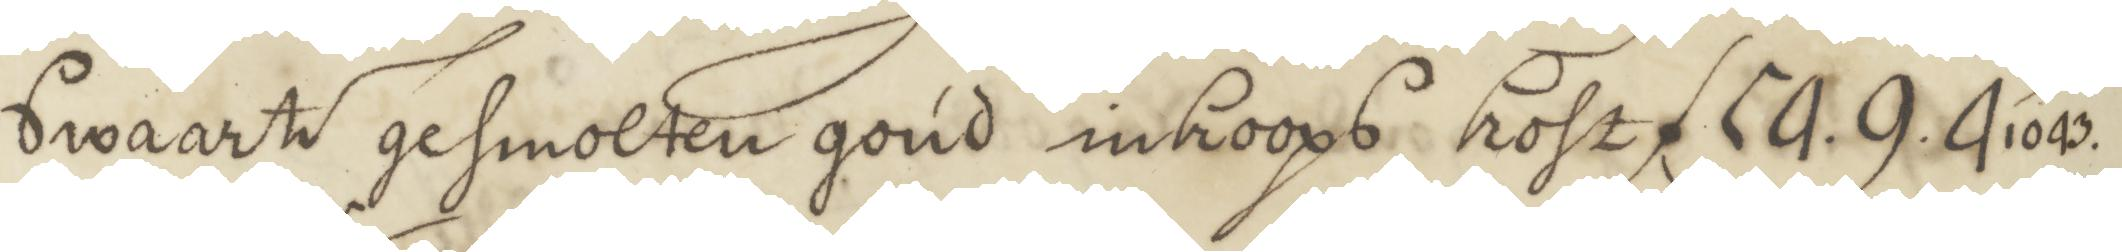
swaarte gesmolten goud inkoops kost ƒ 54. 9. 4 484/1043.
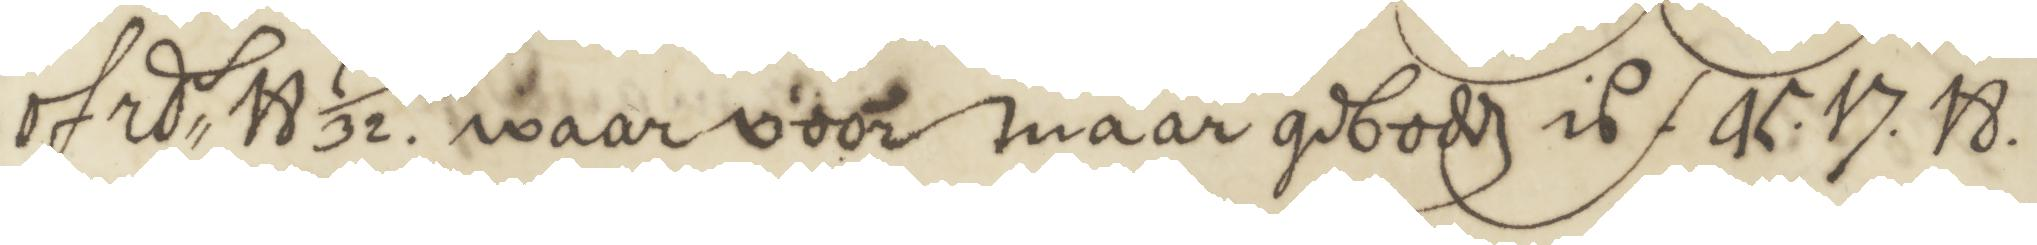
of rd„s 18 5/32. waar voor maar geboden is ƒ 45. 17. 18.
